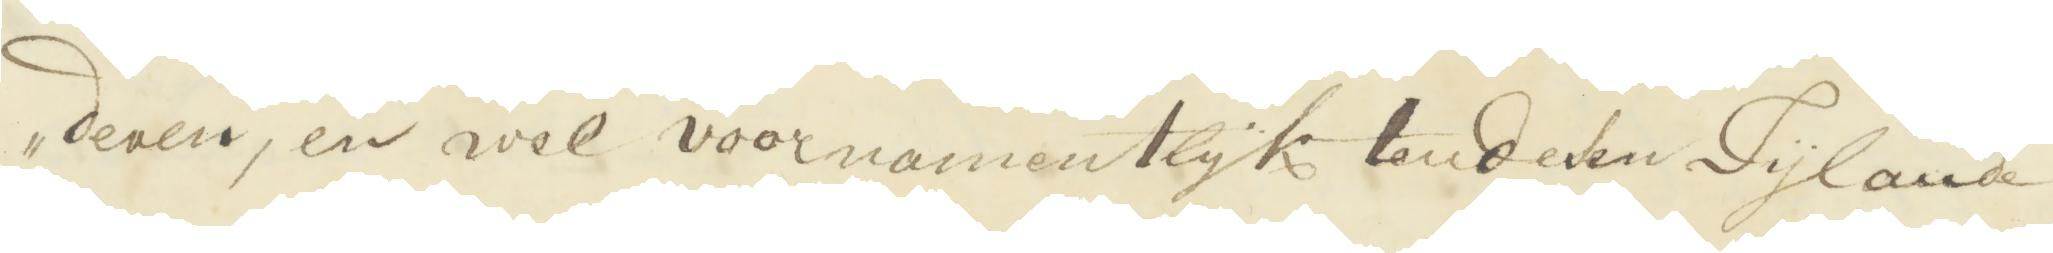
„deren, en wel voornamentlijk ten desen Eijlande
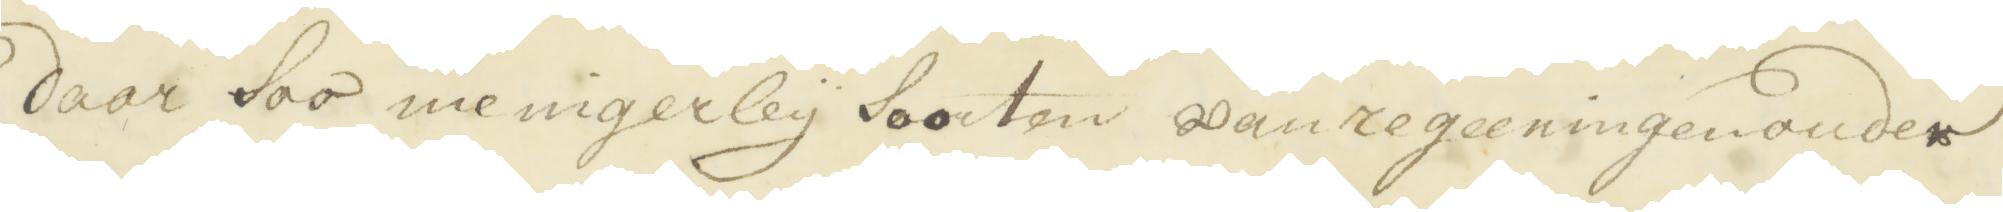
door soo menigerleij soorten van regeeringen onder
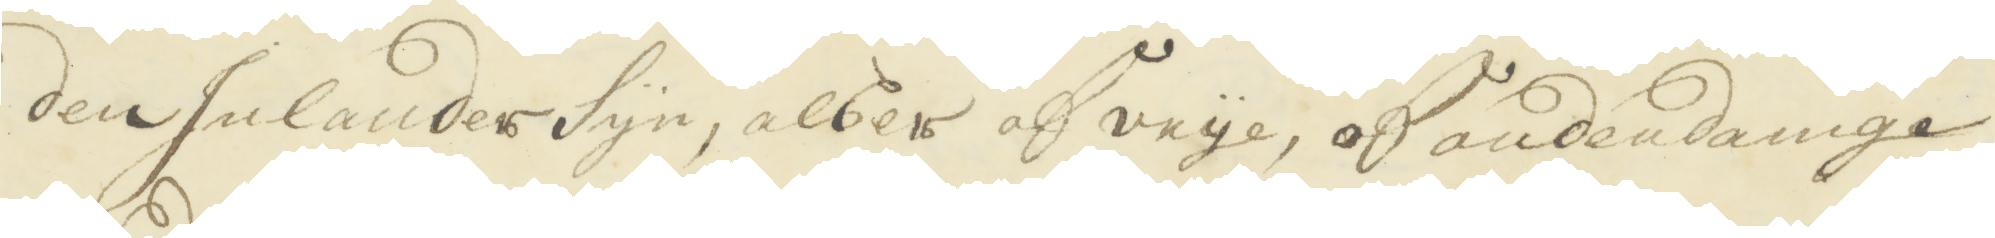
den Jnlander sijn, alser of vrije, of onderdanige
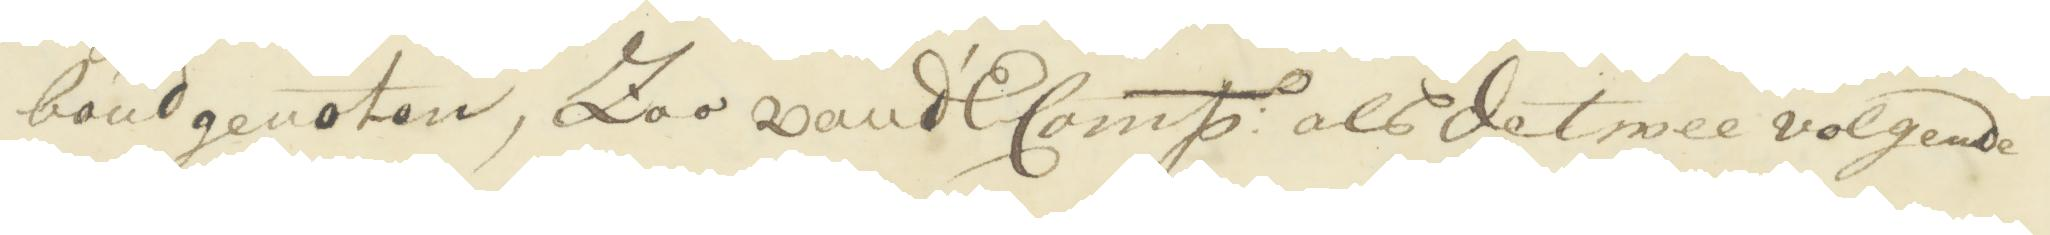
bondgenoten, zoo van d'EComp:e als de twee volgende
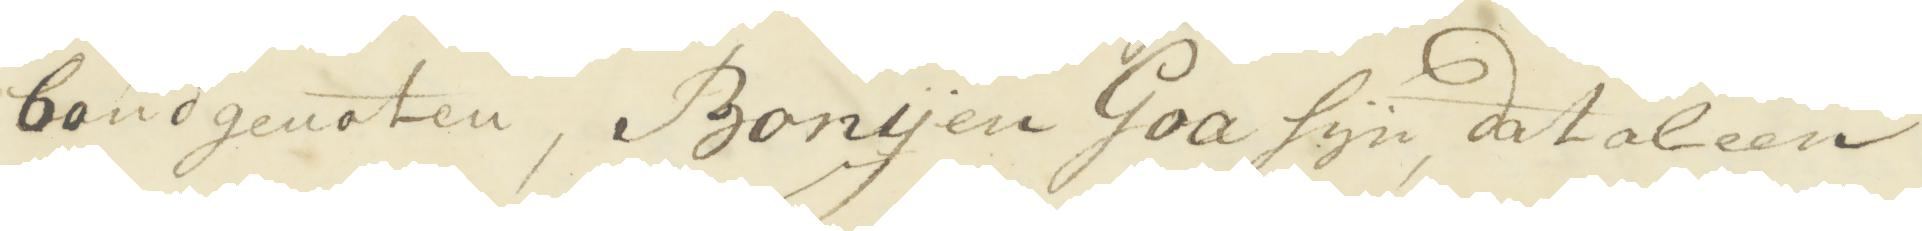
bondgenoten, Bonij en Goa sijn, dat al een
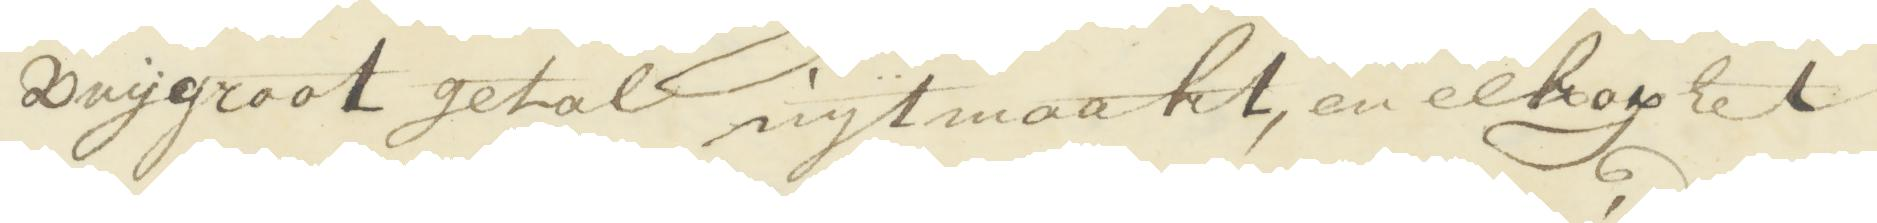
vrijgroot getal uijtmaakt, en elk op het
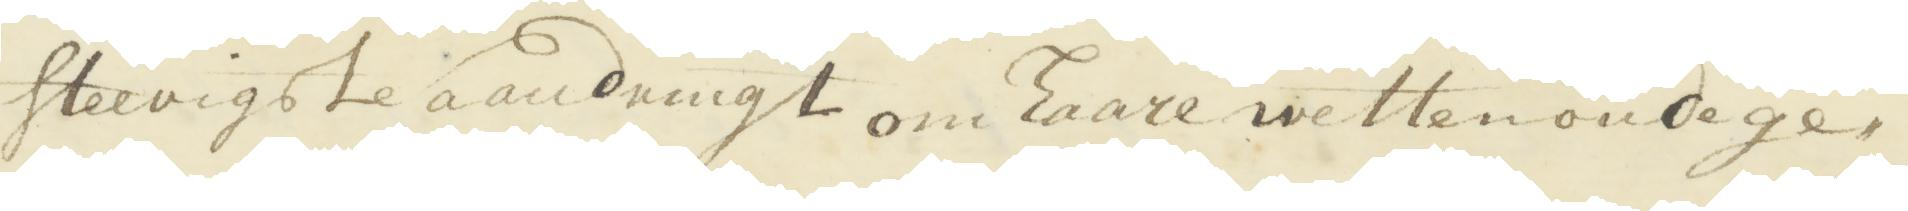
steevigste aandringt om haare wetten oude ge„
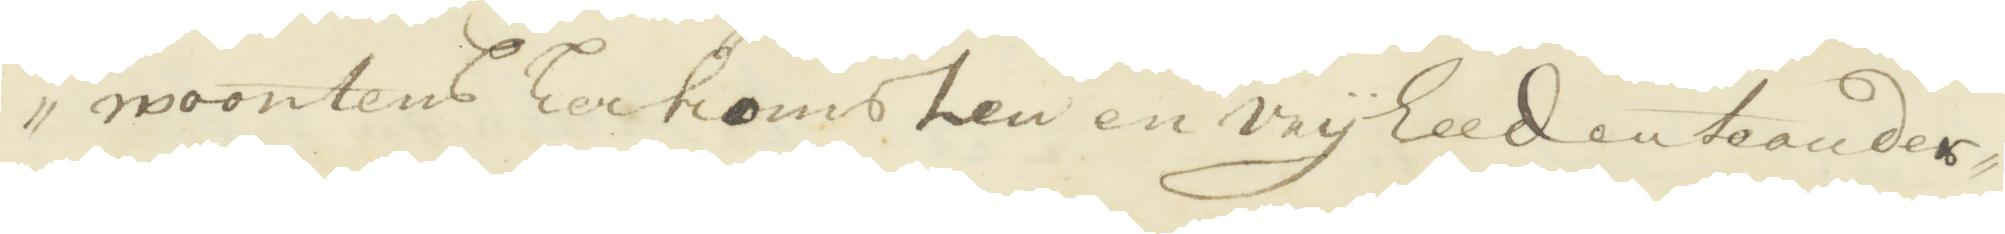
„woontens herkomsten en vrijheeden te onder„
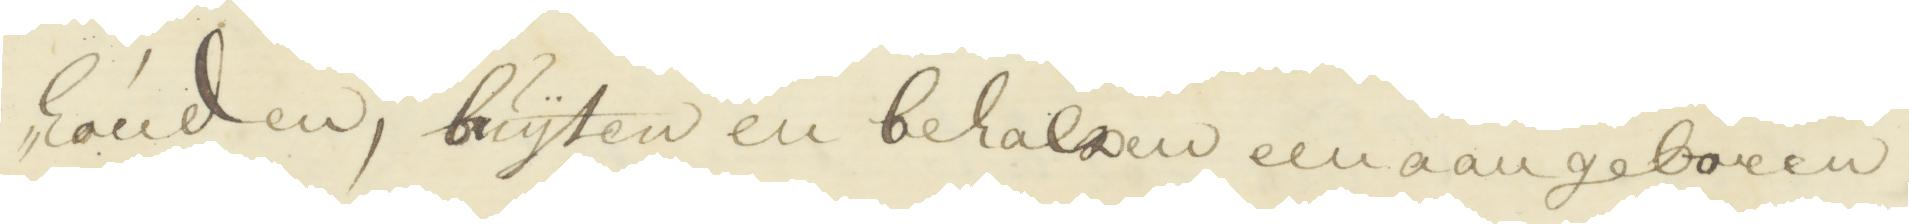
„houden, buijten en behalven een aangeboren
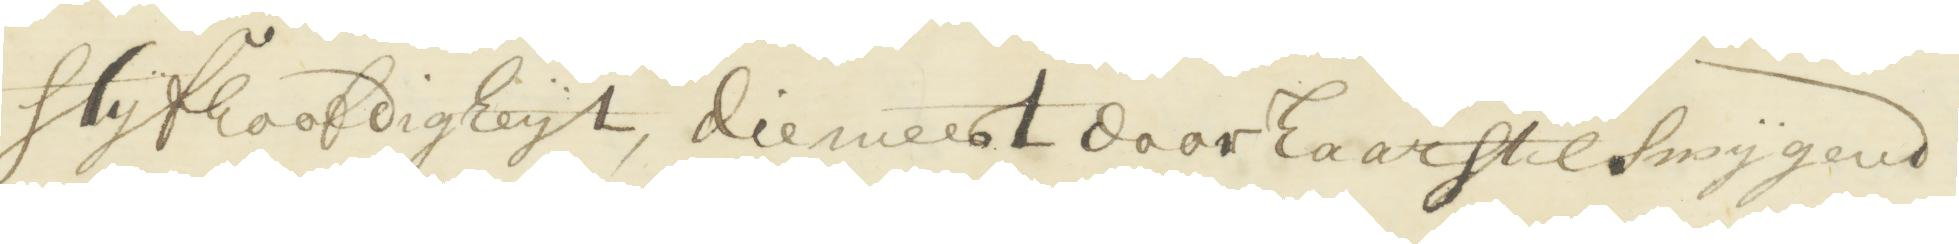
stijfhoofdigheijt, die meest door haar stilswijgend
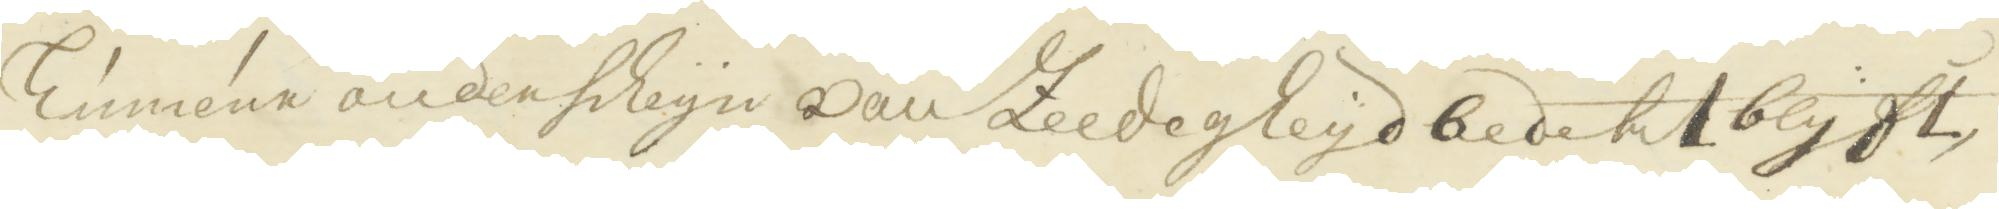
humeur onderscheijn van zeedegheijd bedekt blijft,
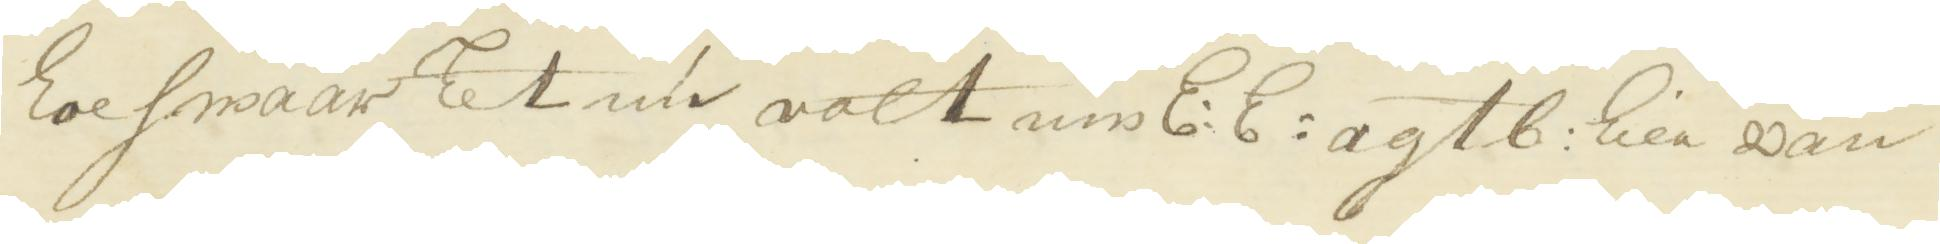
hoe swaar het nu valt uw E: E: agtb: hier van
